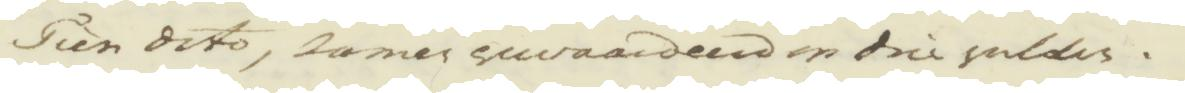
Tien dito, zamen gewaardeerd op drie gulden.
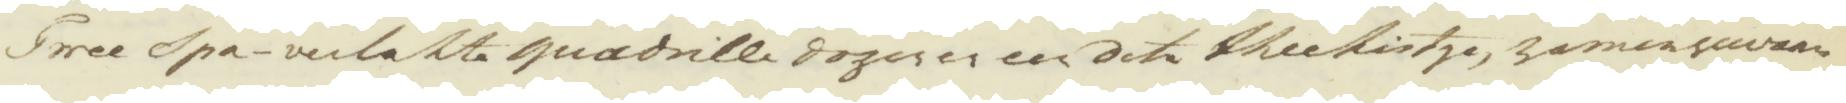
Twee Spa - verlakte quadrille dozen en een dito theekistje, zamen gewaar
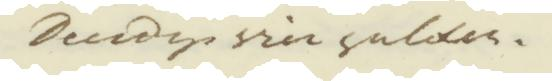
deerd op vier gulden.
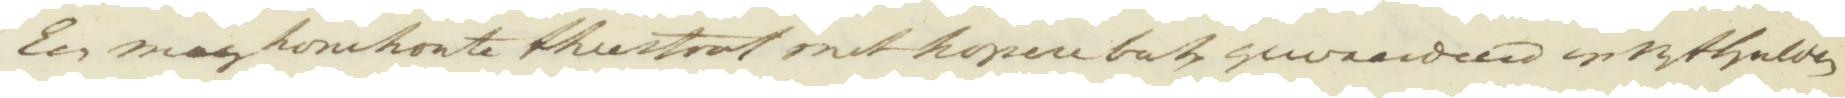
Een maghonihoute theestoof met kopere bak gewaardeerd op vyf Gulden
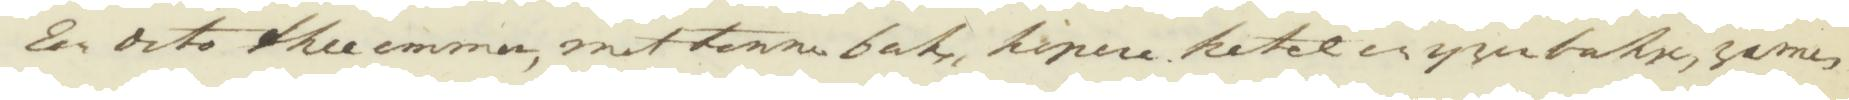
Een dito thee emmer, met tinne bak, kopere ketel en yzerbakje, zamen
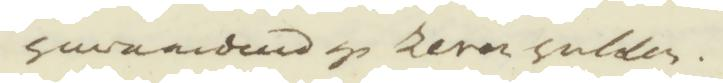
gewaardeerd op zeven gulden.
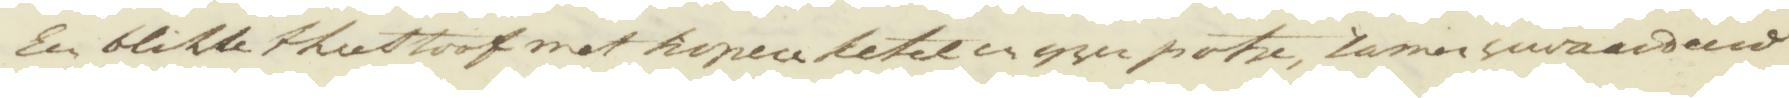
Een blikke theestoof met kopere ketel en yzer potten, zamen gewaardeerd
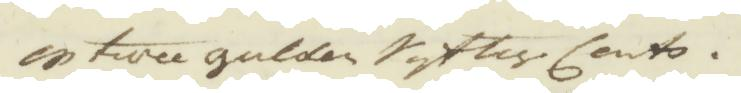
op twee gulden Vyftig Cents.
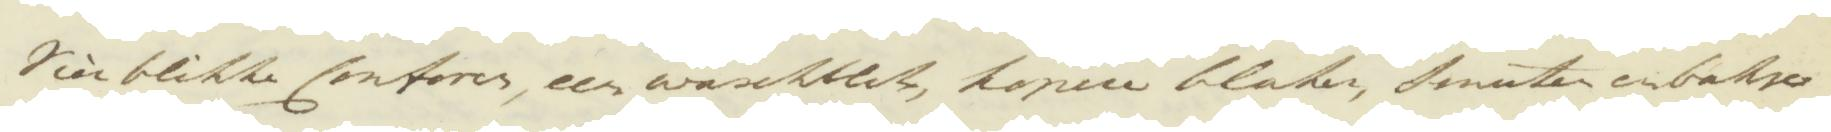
Vier blikke Conforen, een waschblik, kopere blaker, smuten en bakjes
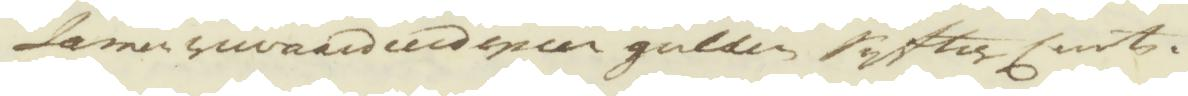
Zamen gewaardeerd op een gulden Vyftig Cents.
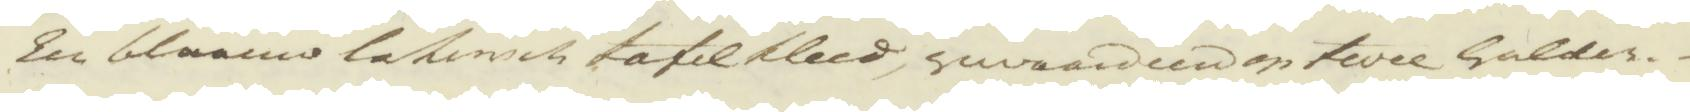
Een blaaw lakensch tafelkleed, gewaardeerd op twee Gulden.
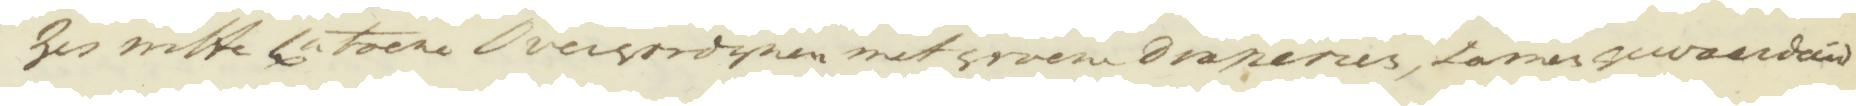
Zes nette Catoene Overgordynen met groene draperien, zamen gewaardeerd
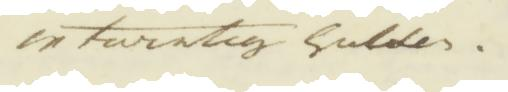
op twintig Gulden.
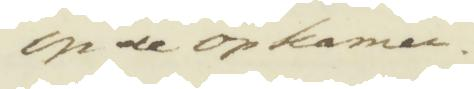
op de opkamer
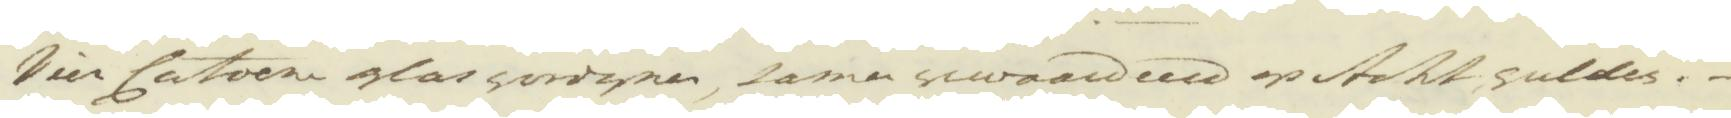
Vier Catoene glasgordynen, zamen gewaardeerd op Acht gulden.
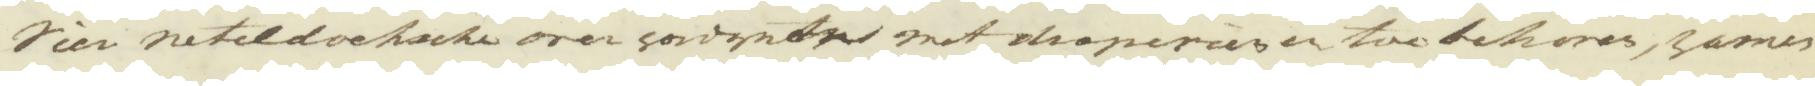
Vier neteldoeksche over gordyntjes met draperien en toebehoren, zamen
